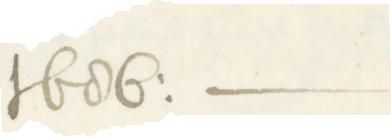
1686: —
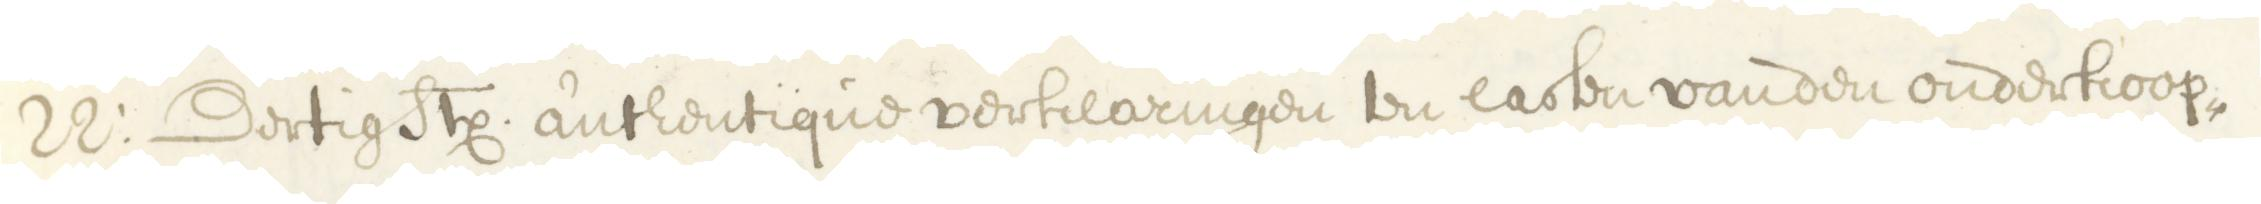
22: DertigStx. authentique verklaringen ten lasten van den onderkoop„
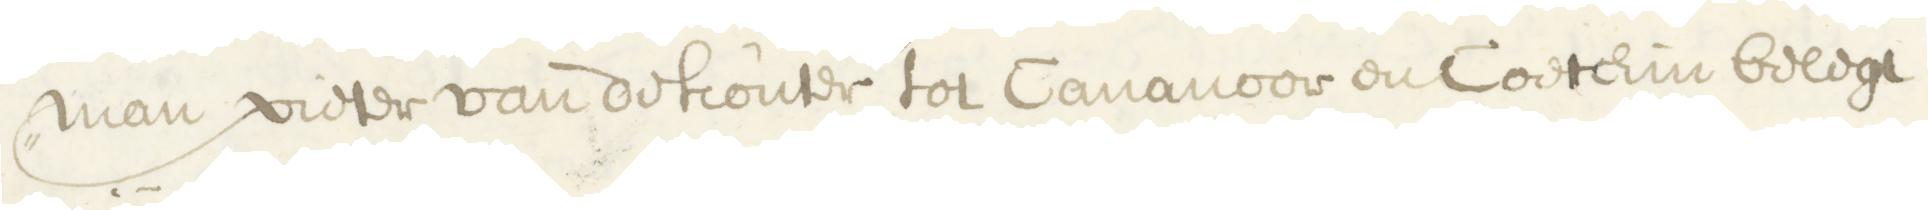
„man pieter van dekouter tot Cananoor en Coetchin belegt
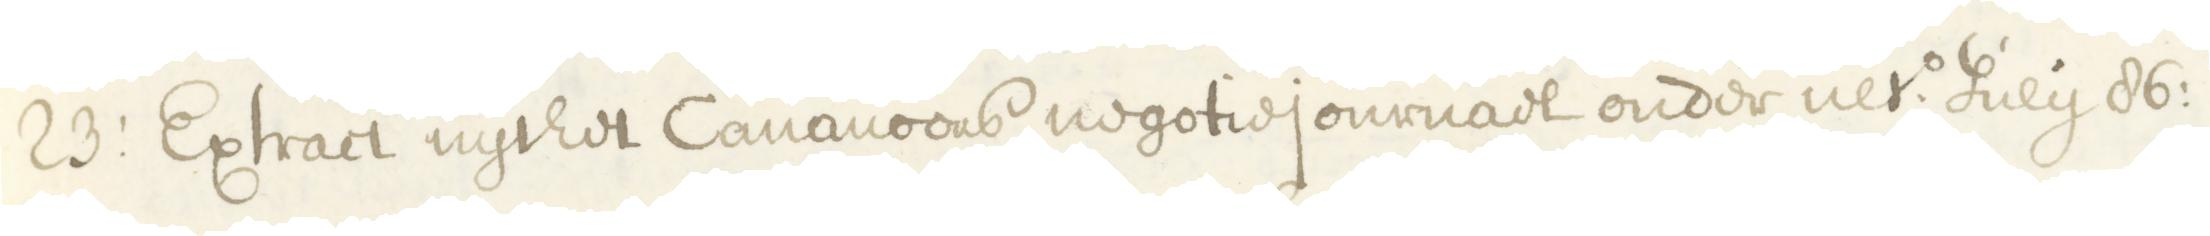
23: Extract uijt het Cananoors negotiejournael onder ult:o Iulij 86:
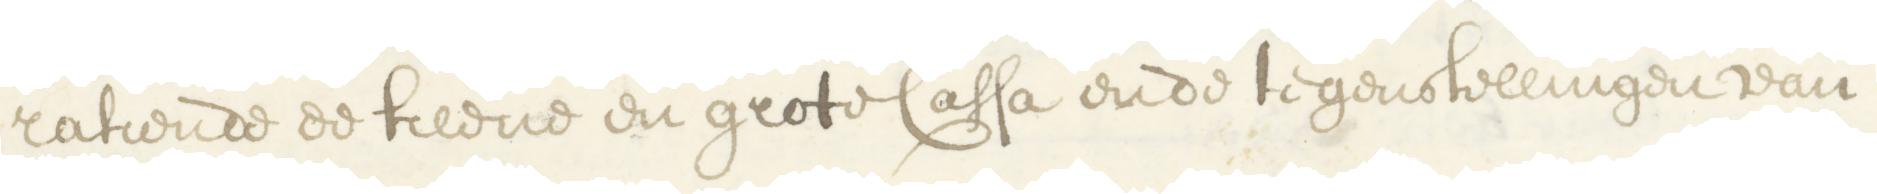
rakende de klene en grote Cassa ende tegenstellingen van
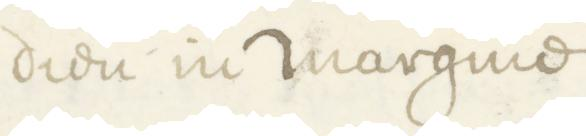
dien in margine
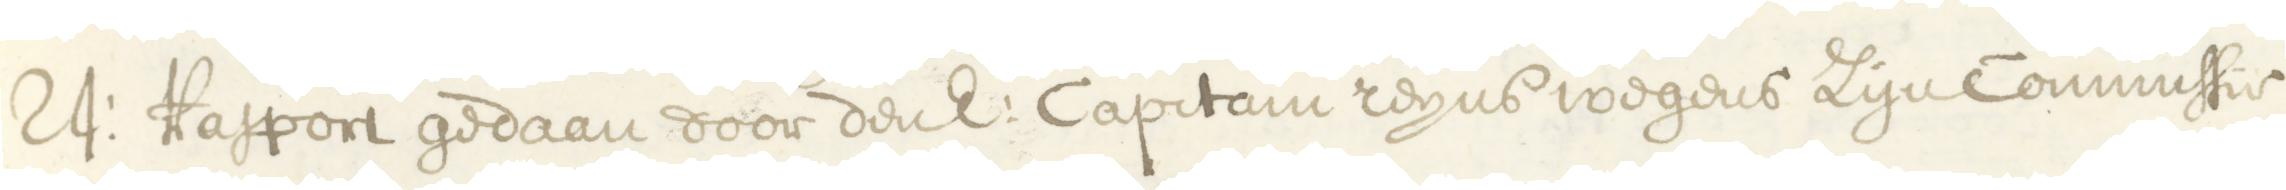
24: Rapport gedaan door den E: Capitain reijns wegens zijn commissie
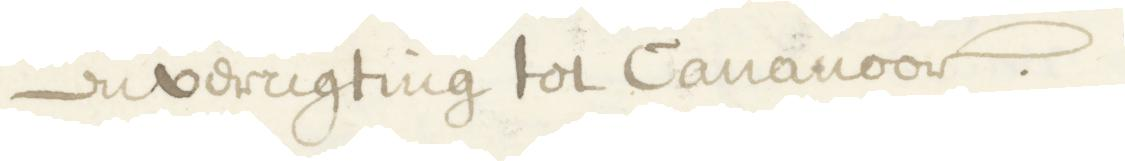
enverrigting tot Cananoor.
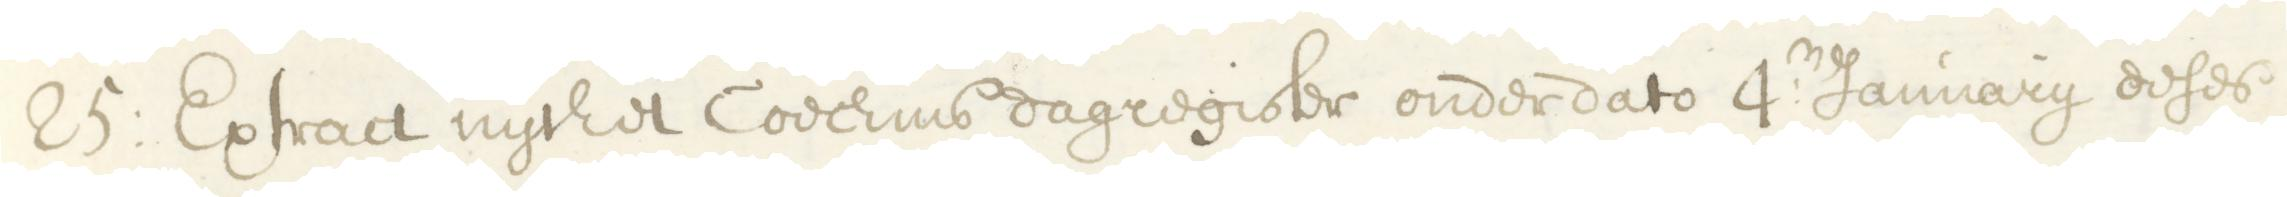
25: Extract uijt het Coechins dagregister onder dato 4:en Januarij deses
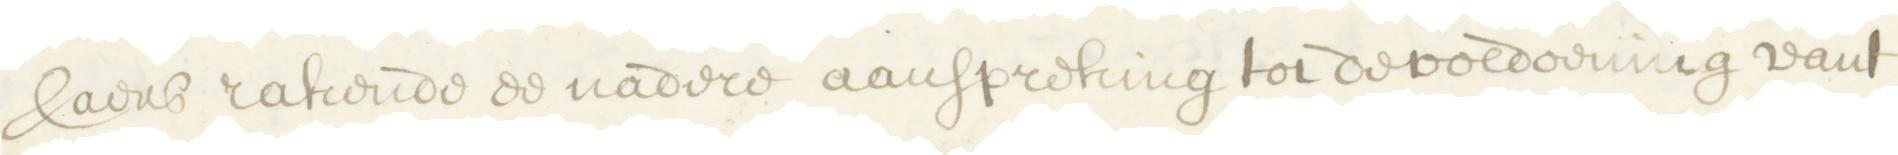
Jaers rakende de nadere aanspreking tot devoldoening vant
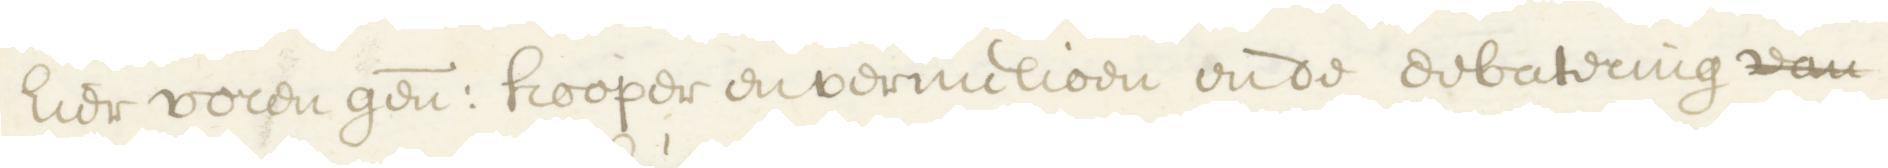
hier voren gen: kooper en vermilioen ende debatering van
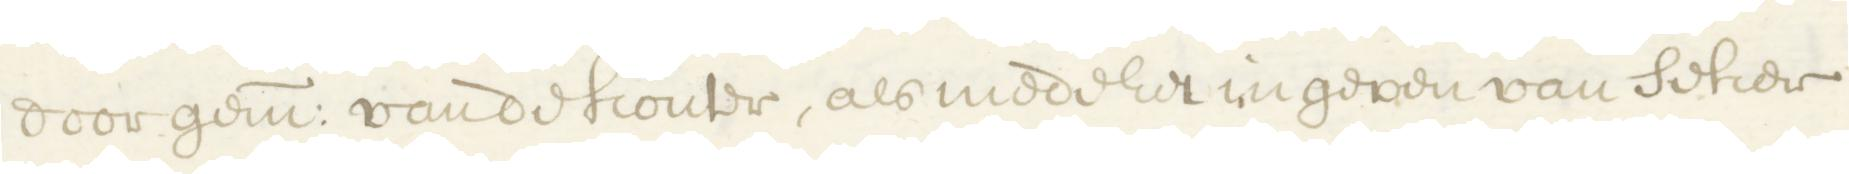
door gem: van dekouter, als mede het in geven van seker
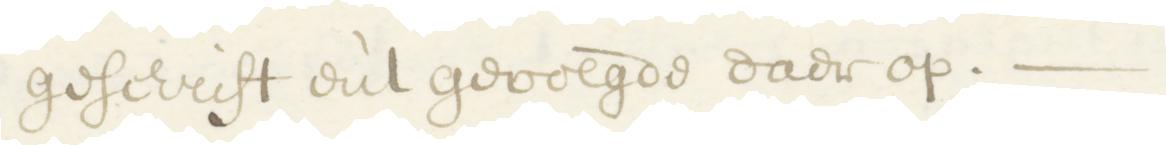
geschrift en't gevolgde daer op. —
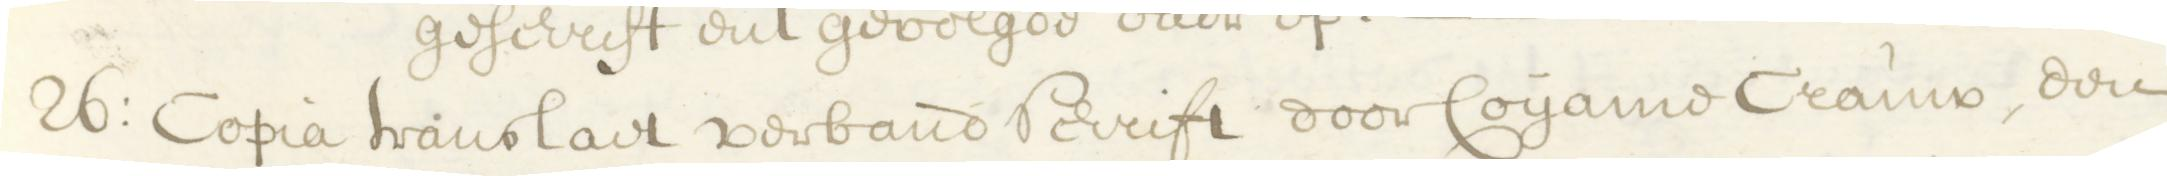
26: Copia translaet verbandschrift door Coijame Crauw, den
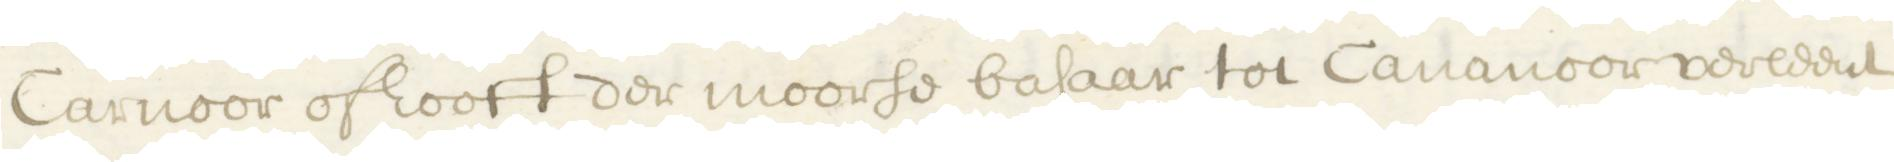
Carnoor of hooft der moorse basaar tot Cananoor verleent
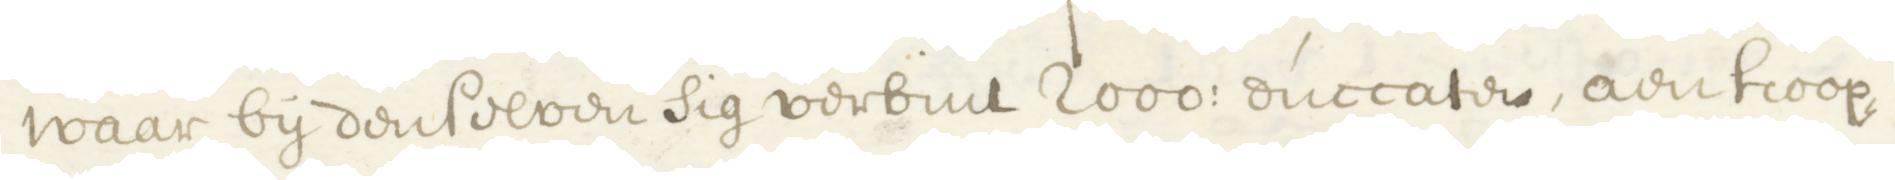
waar bij denselven sig verbint 2000: duccaten, aen koop„
